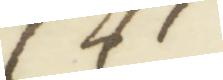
741
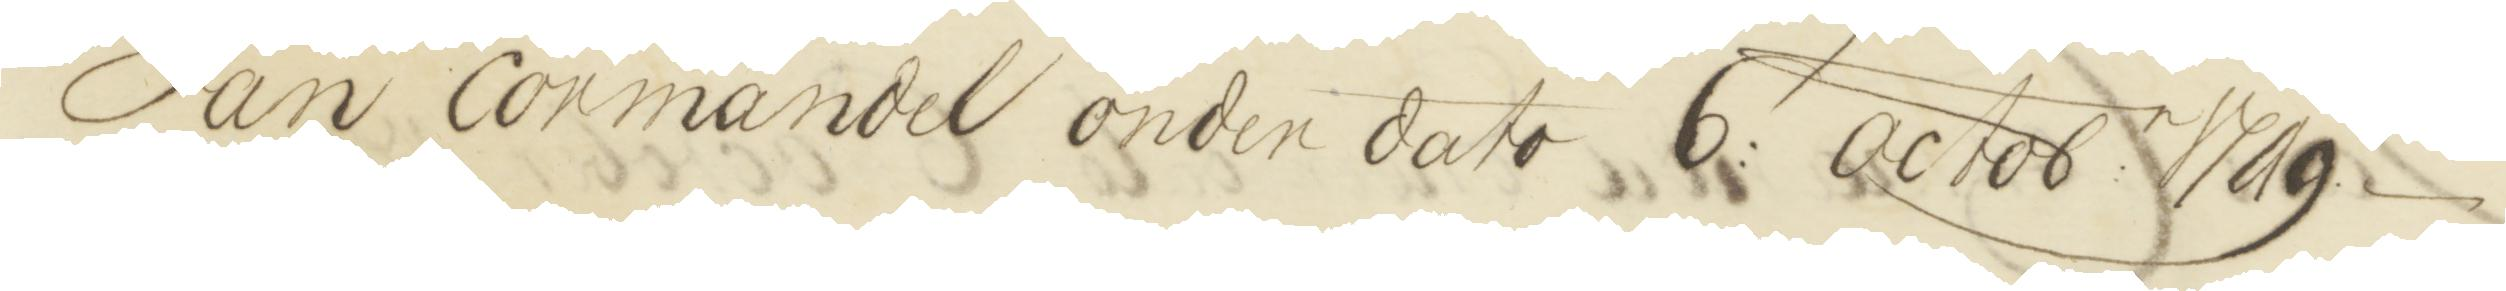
Van Cormandel onder dato 6:' octob:r 1749. —
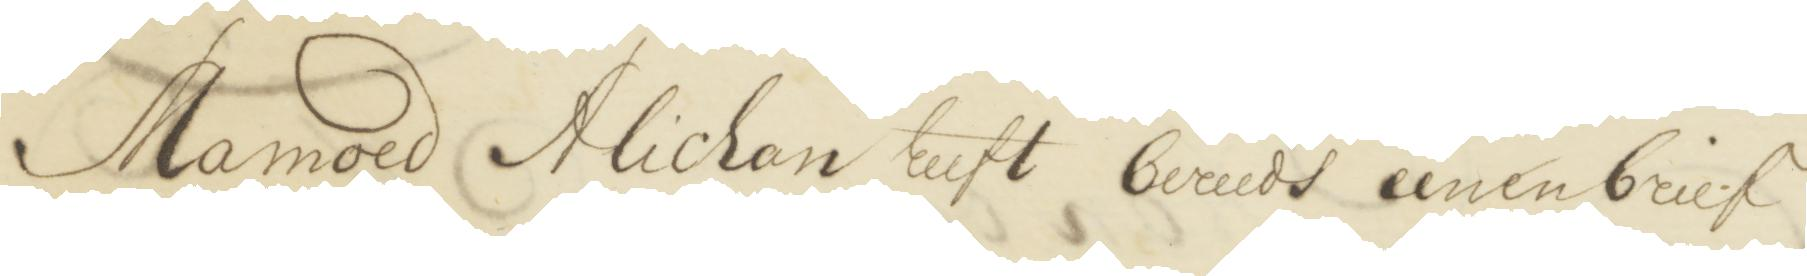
Mamoed Alichan heeft bereeds eenen brief
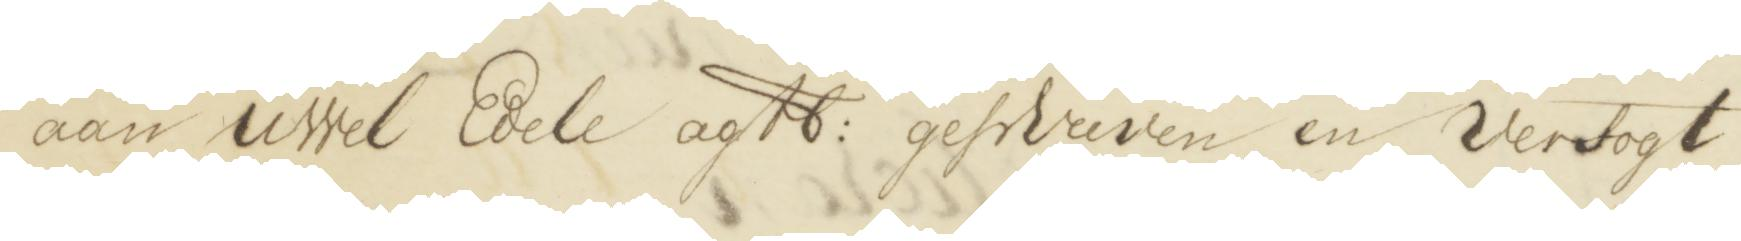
aan uwel Edele agtb: geschreven en versogt
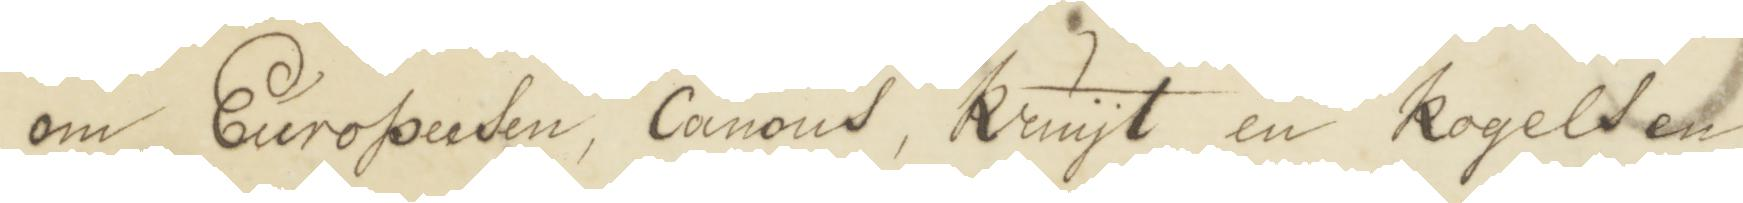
om Europeesen, canons, kruijt en kogels en
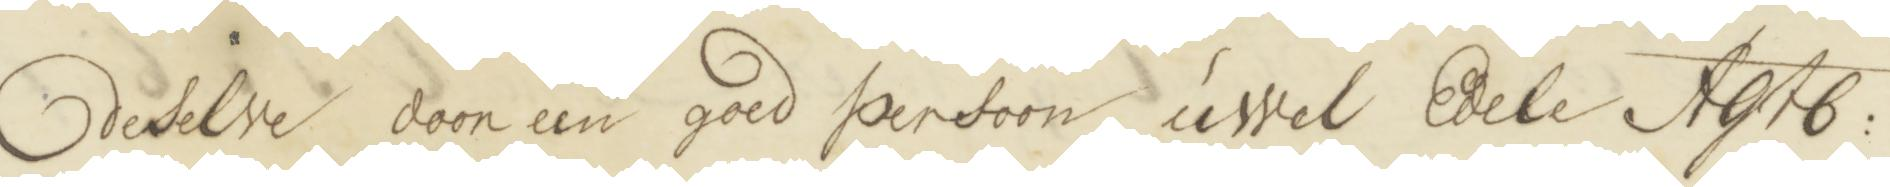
deselve door een goed persoon, uwel Edele Agtb:
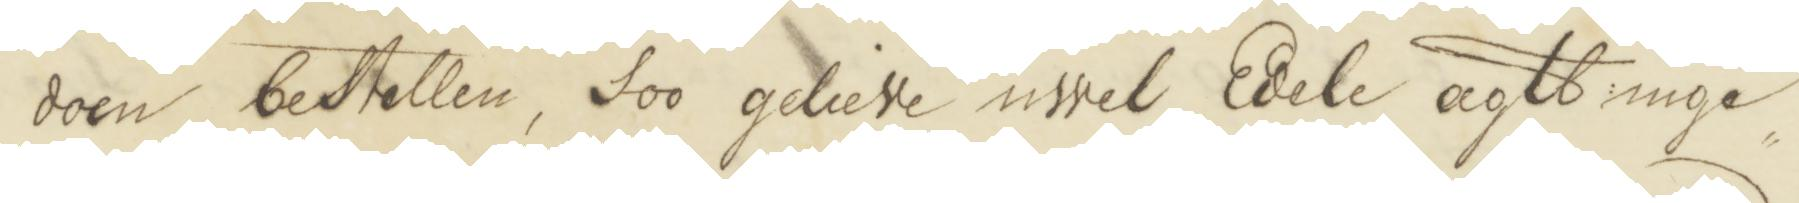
doen bestellen, soo gelieve uwel Edele agtb: inge„
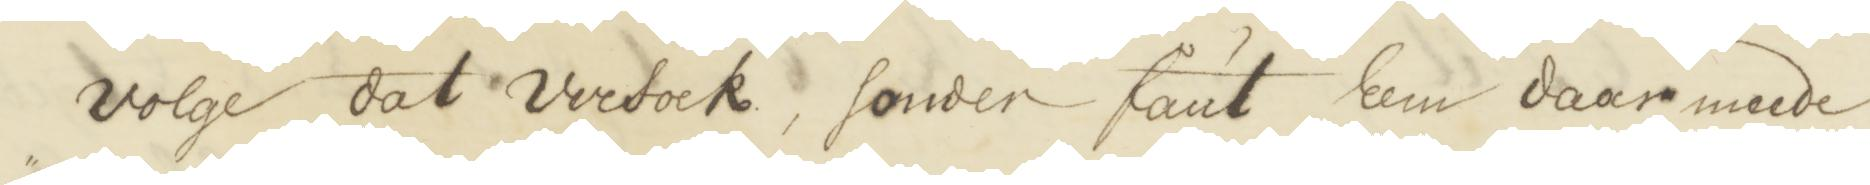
„volge dat versoek, sonder faut hem daar meede
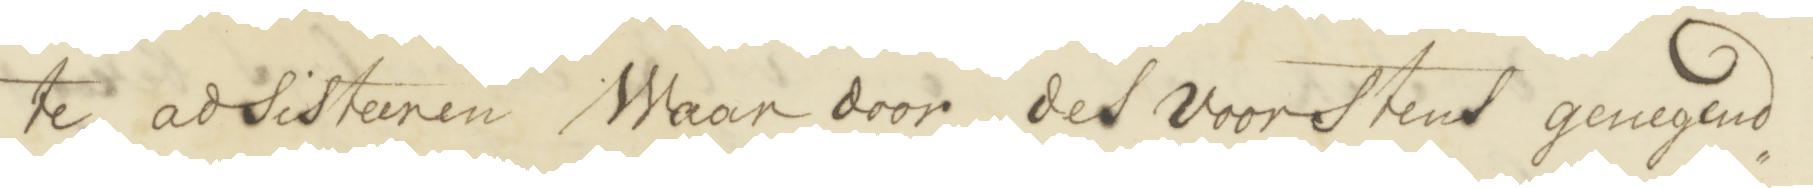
te adsisteeren Waar door des voorstens genegend„
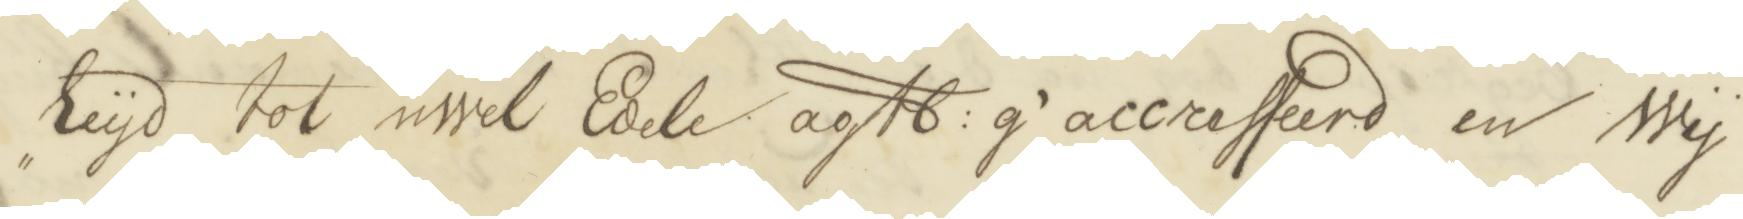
„heijd tot uwel Edele agtb: g’accresseerd en wij
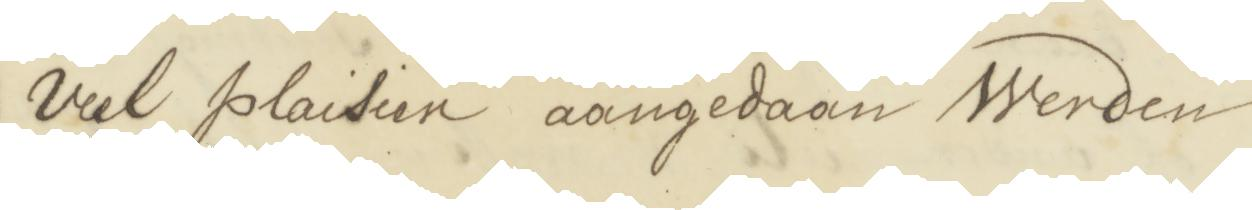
veel plaisier aangedaan werden
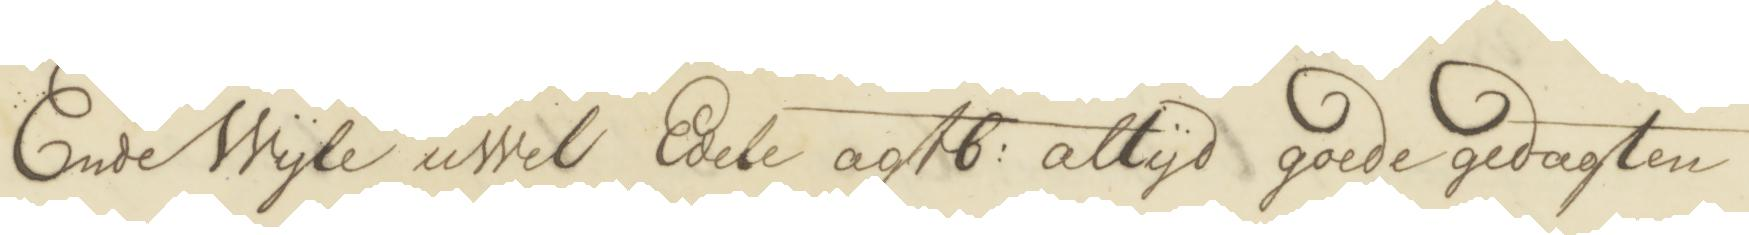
Ende wijle uwel Edele agtb: altijd goede gedagten
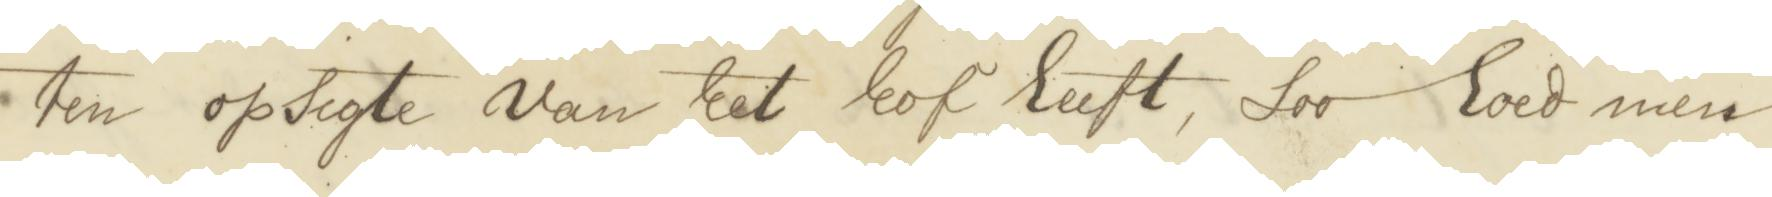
ten opsigte van het hof heeft, soo hoed men
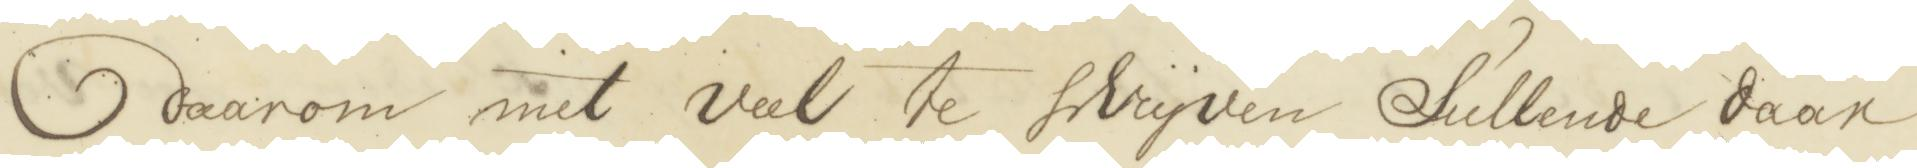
daarom niet veel te schrijven sullende daar
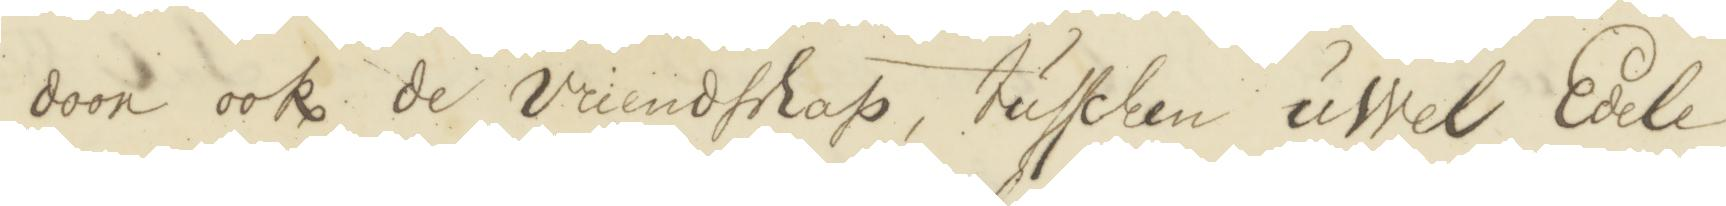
door ook de vriendschap, tusschen uwel Edele
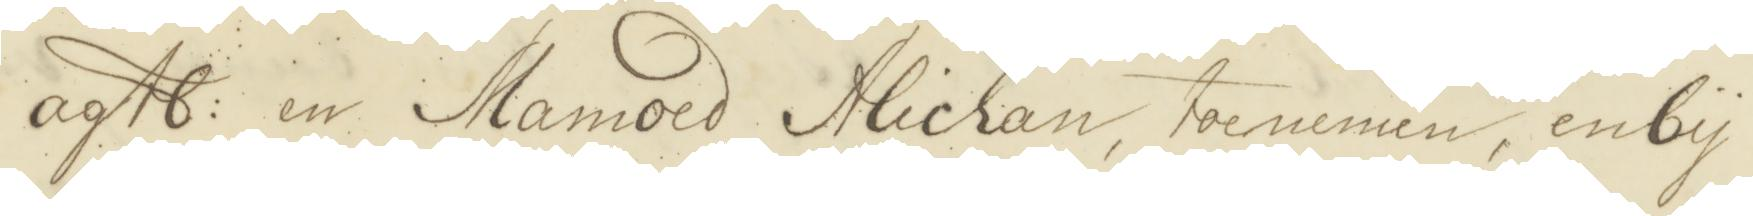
agtb: en Mamoed Alichan, toenemen, en bij
